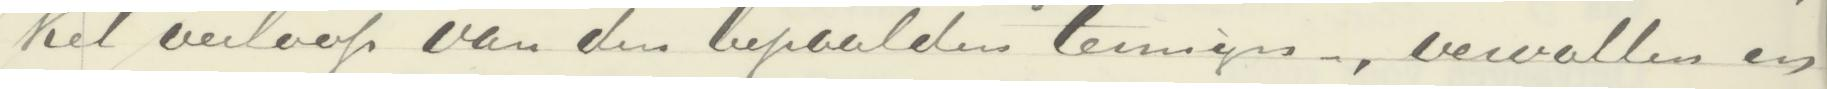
kel verloop van den bepaalden termijn - , vervallen en
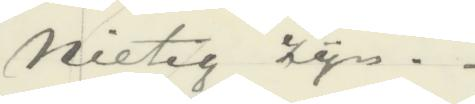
nietig zijn.
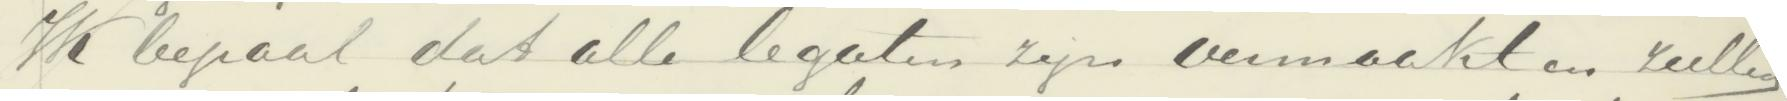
Ik bepaal dat alle legaten zijn vermaakt en zullen
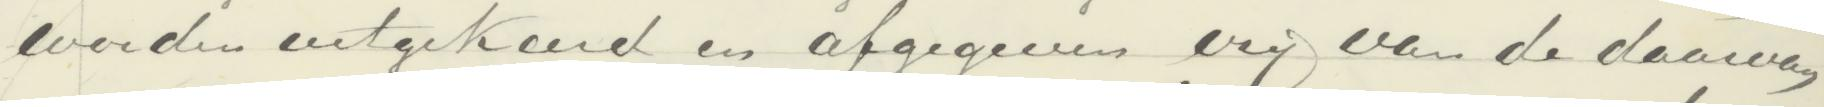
worden uitgekeerd en afgegeven vrij van de daarvan
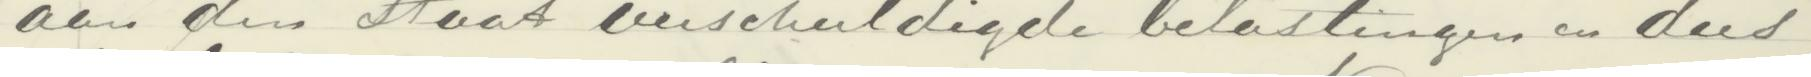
aan den staat verschuldigde belastingen en dus
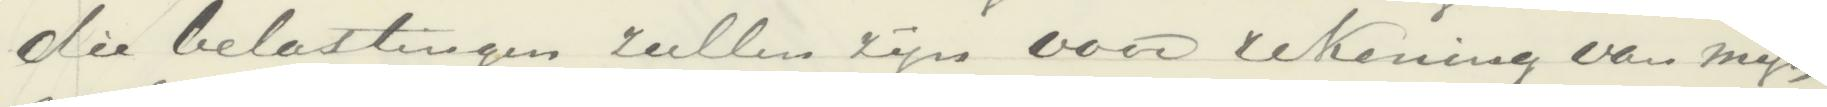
die belastingen zullen zijn voor rekening van myn
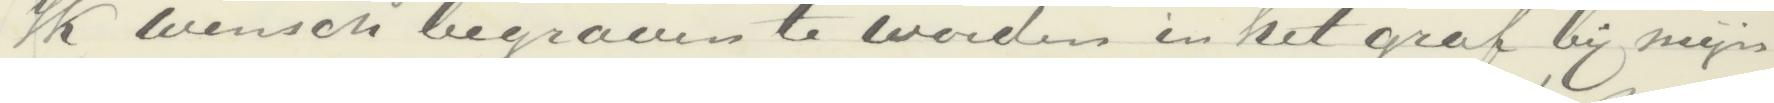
Ik wensch begraven te worden in het graf bij mijn
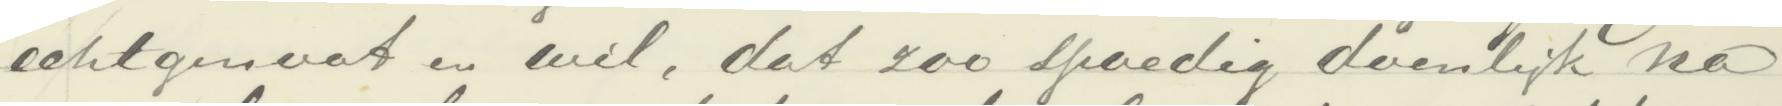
echtgenoot en wil, dat zoo spoedig doenlijk na
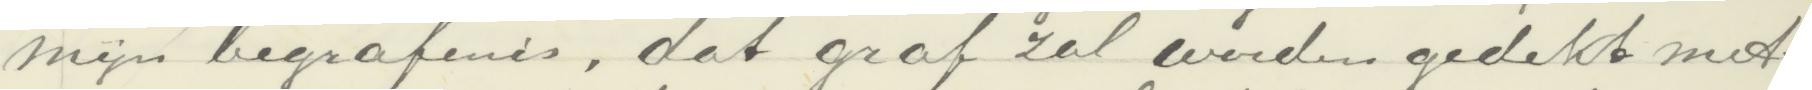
mijn begrafenis, dat graf zal worden gedekt met
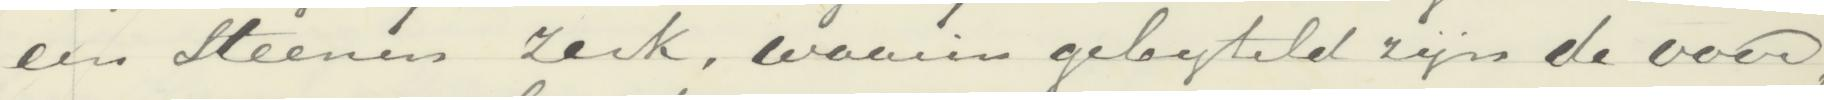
een steenen zerk, waarin gebyteld zijn de voor
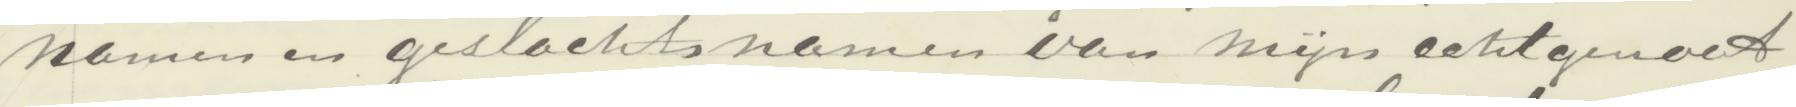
namen en geslachtsnamen van mijn echtgenoet
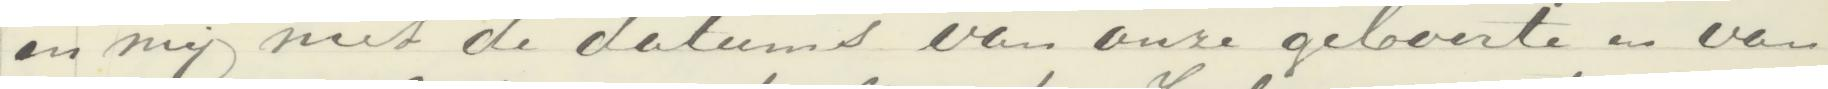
en mij met de datums van onze geboorte en van
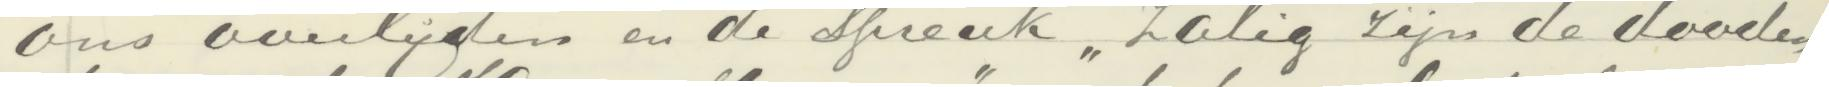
ons overlijden en de spreuk „zalig zijn de dooden
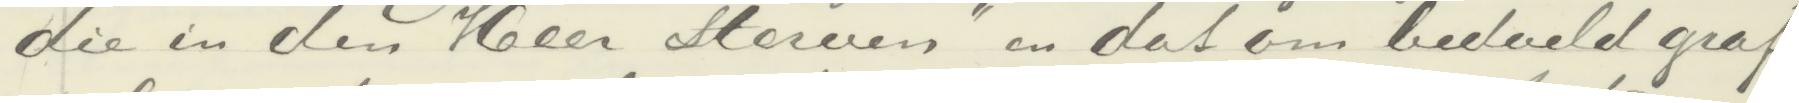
die in den Heer sterven" en dat om bedoeld graf
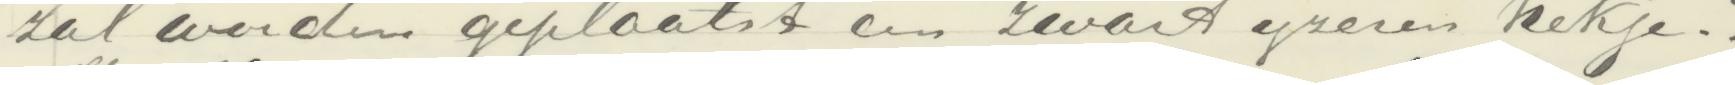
zal werden geplaatst en zwart yzeren hekje.
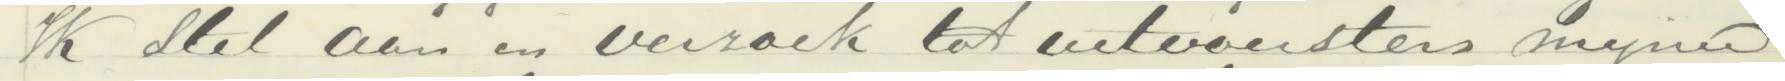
Ik stel aan en verzoek tot uitvoersten myner
